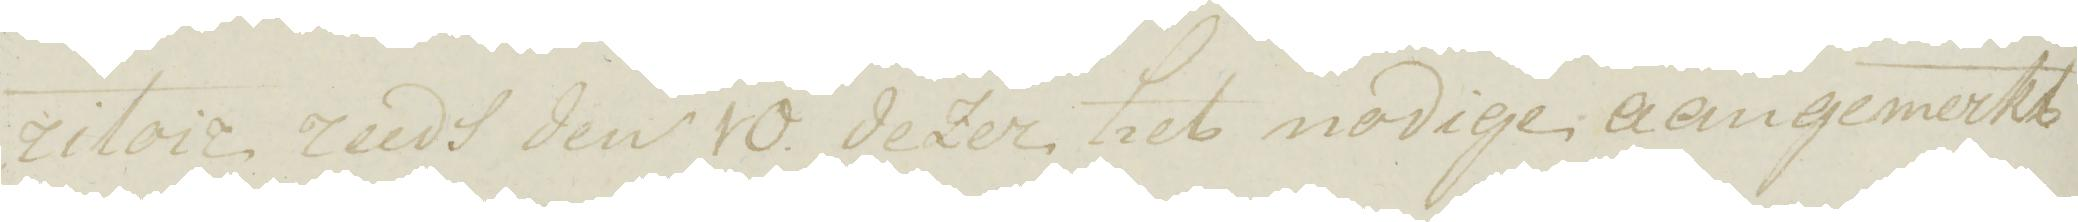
ritoir reeds den 10. dezer het nodige aangemerkt
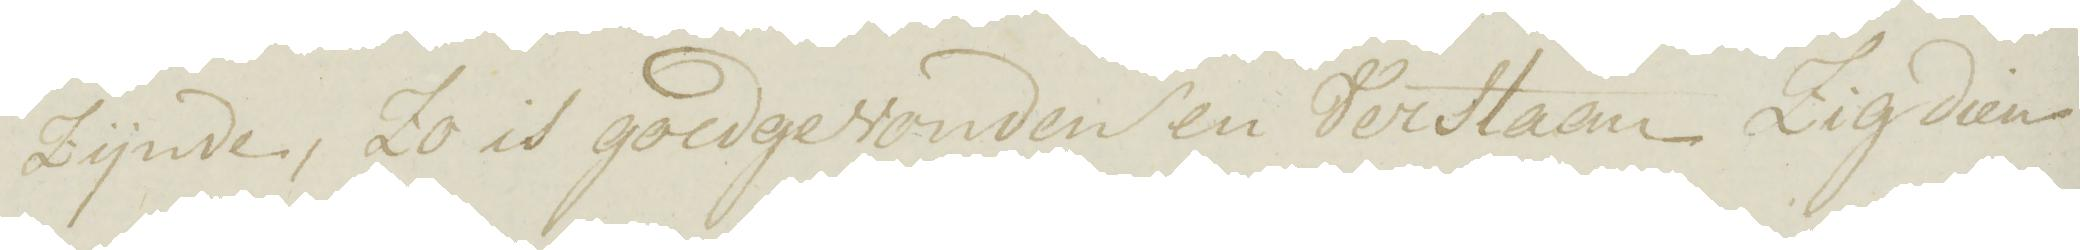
zijnde, zo is goedgevonden en verstaan zig dien
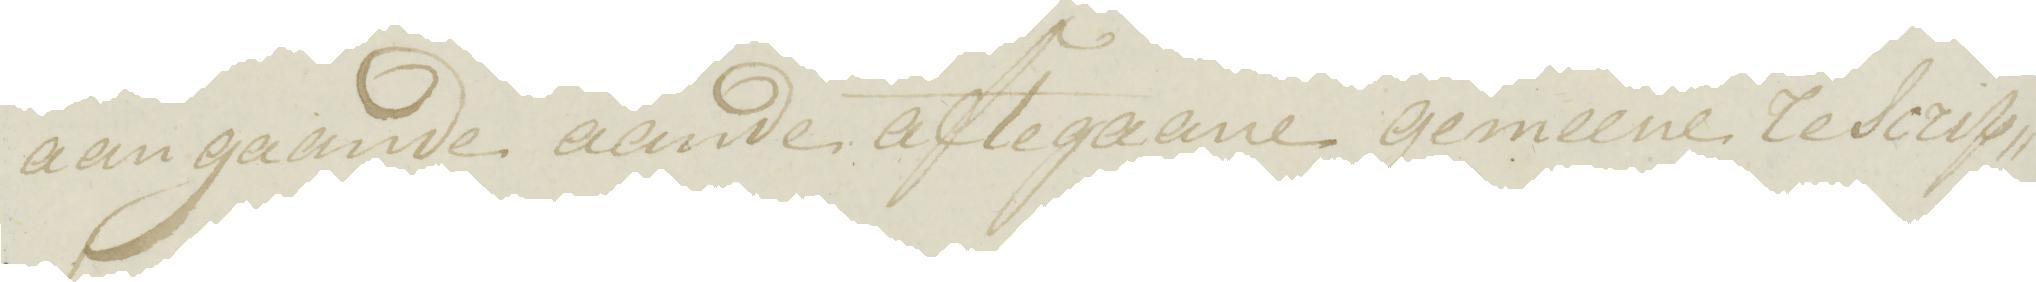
aangaande aan de aftegaane gemeene rescrip„
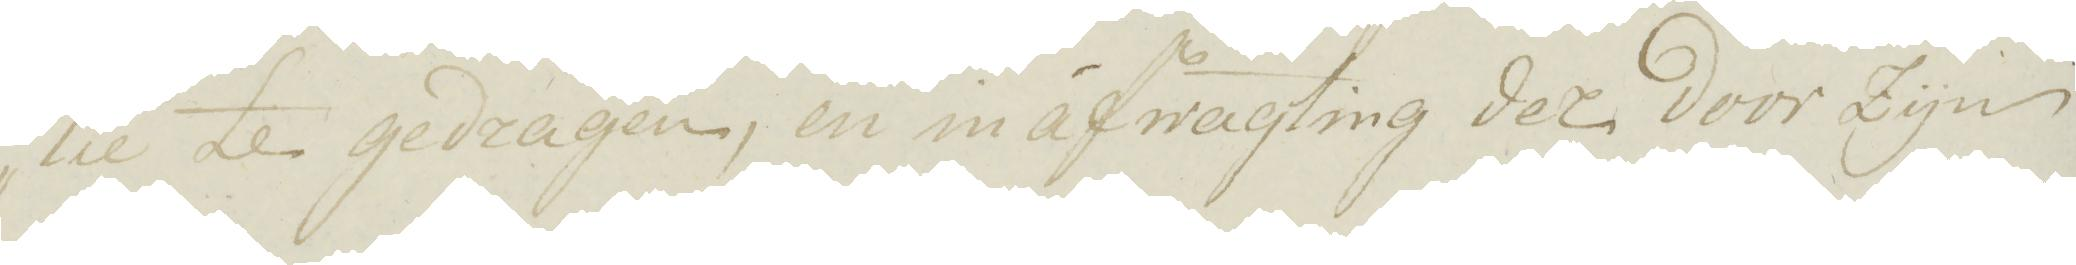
„tie te gedragen, en in afwagting der door zijn
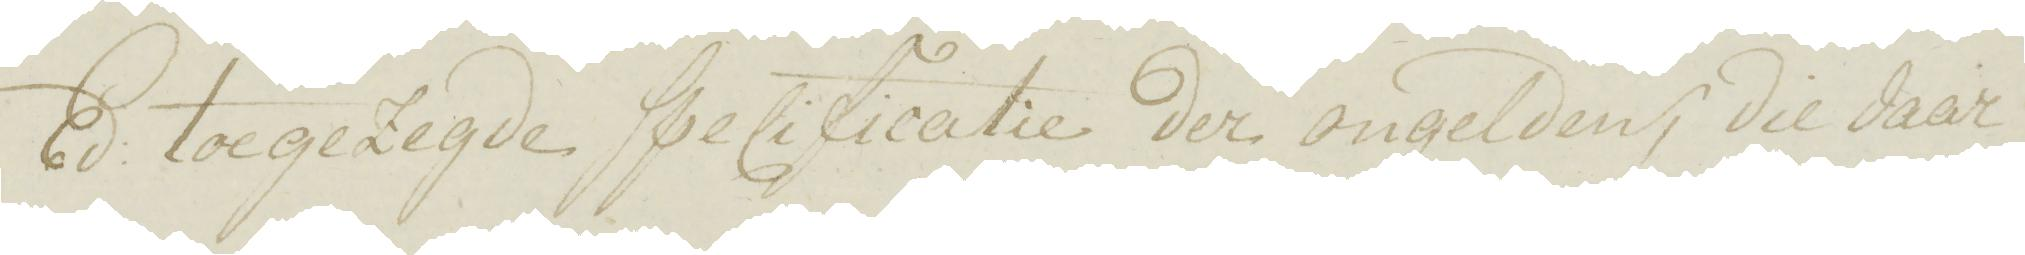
Ed: toegezegde specificatie der ongelden, die daar
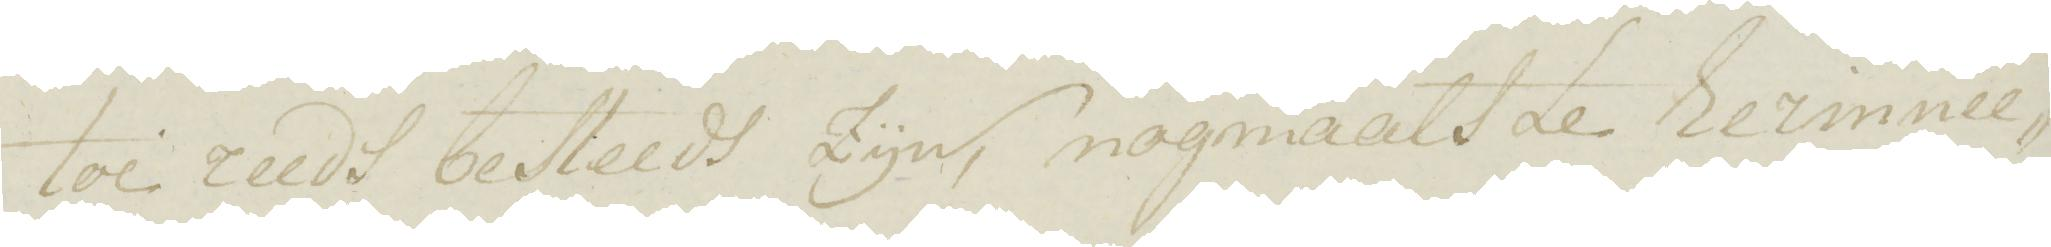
toe reeds besteeds zijn, nogmaats te herinnee„
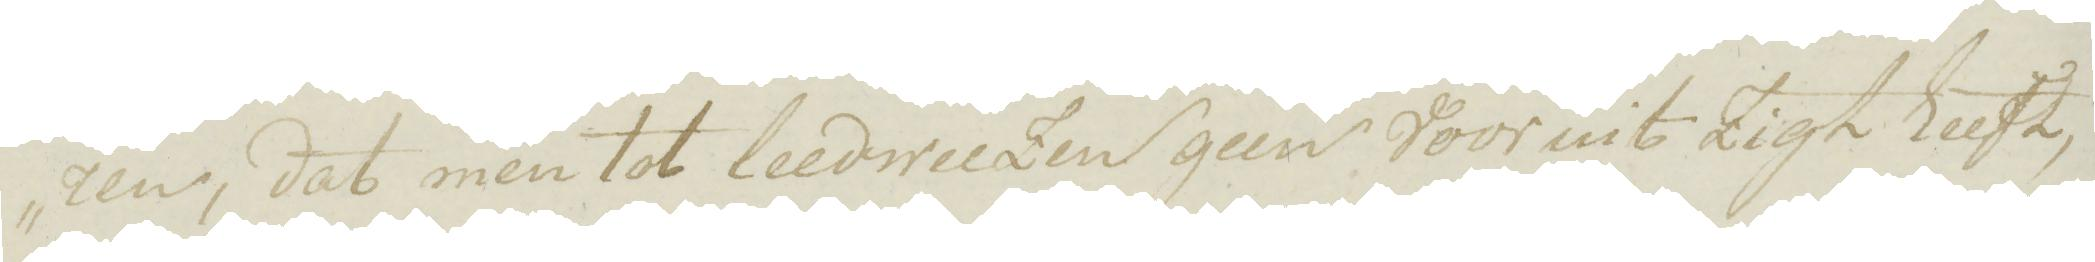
ren, dat men tot leedweezen geen vooruit zigt heeft,
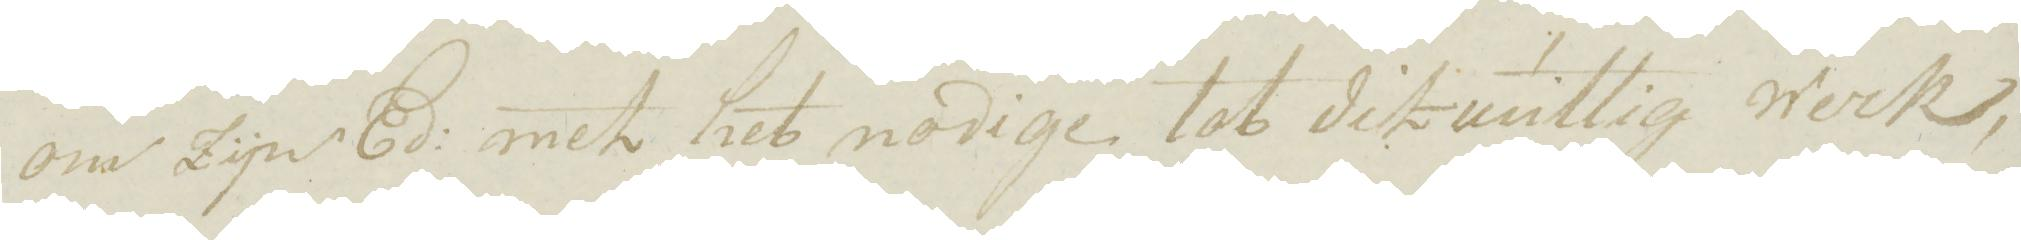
om zijn Ed: met het nodige tot dit nuttig werk,
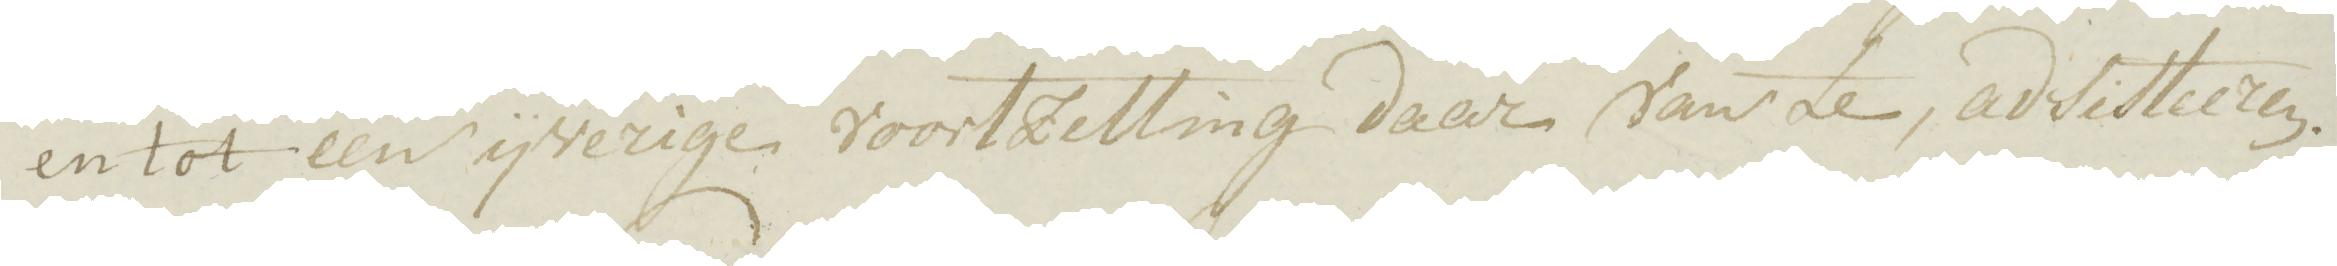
en tot een ijverigen voortzetting daar van te, adsisteeren.
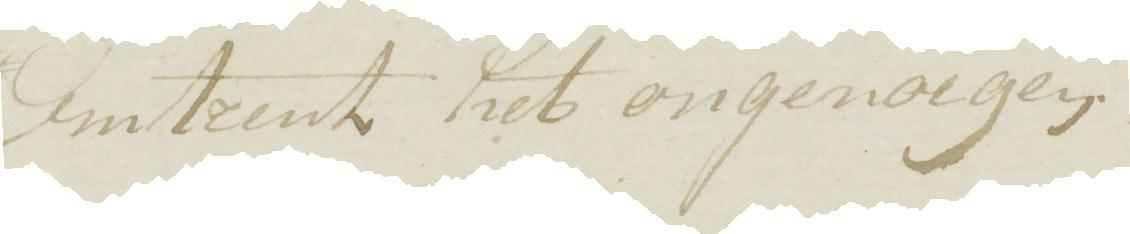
Omtrent het ongenoegen.
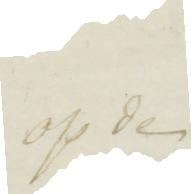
op de
